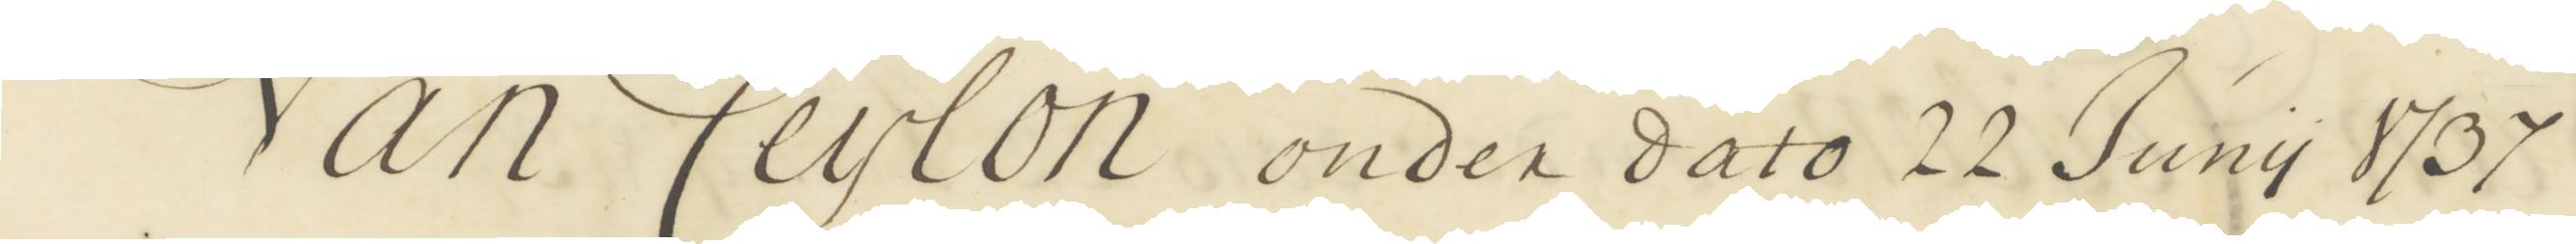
Van Ceylon onder dato 22 Iunij 1737
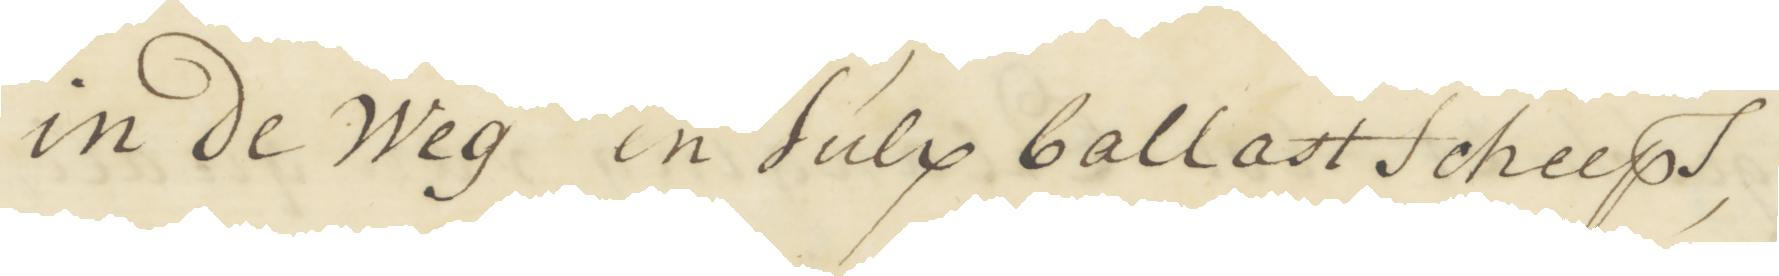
in de Weg en sulx ballastscheeps,
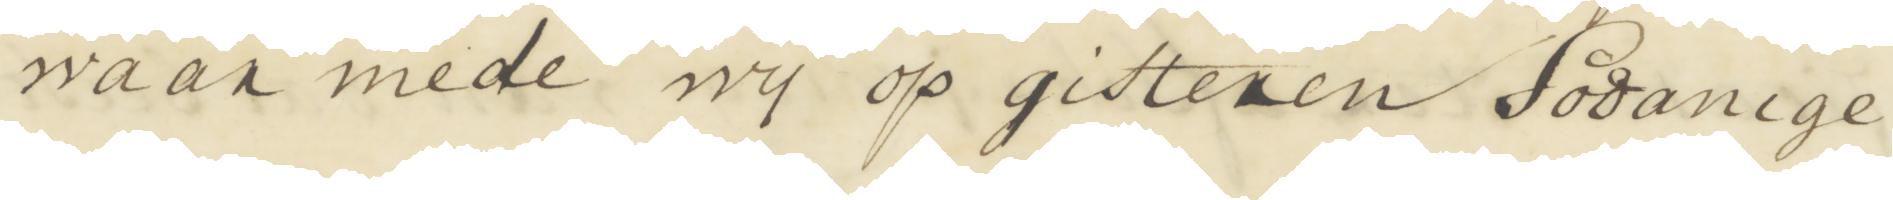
waar mede wij op gisteren sodanige
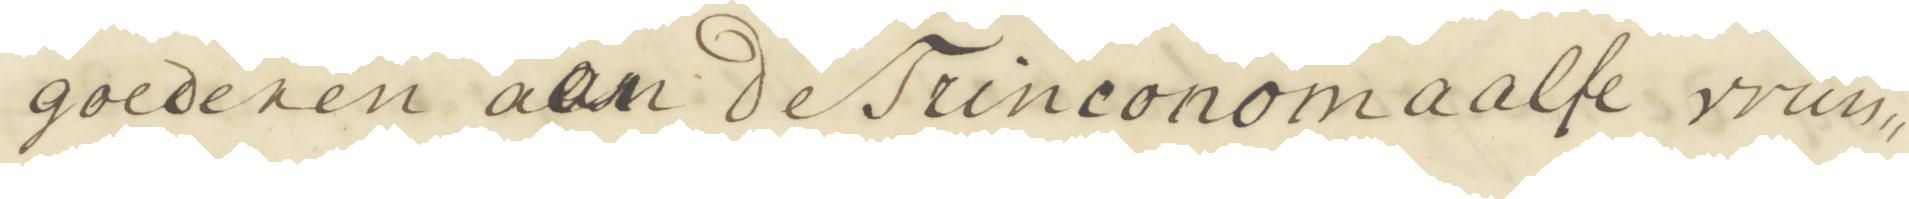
goederen aan de Trinconomaalse vrun„
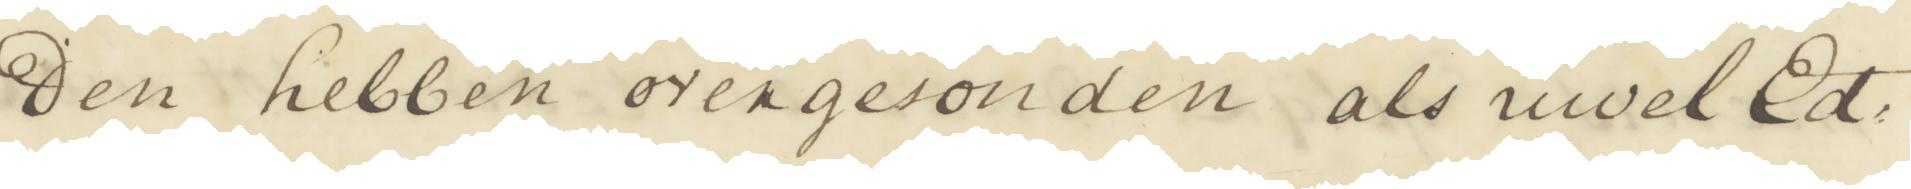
den hebben overgesonden als uwel Ed:
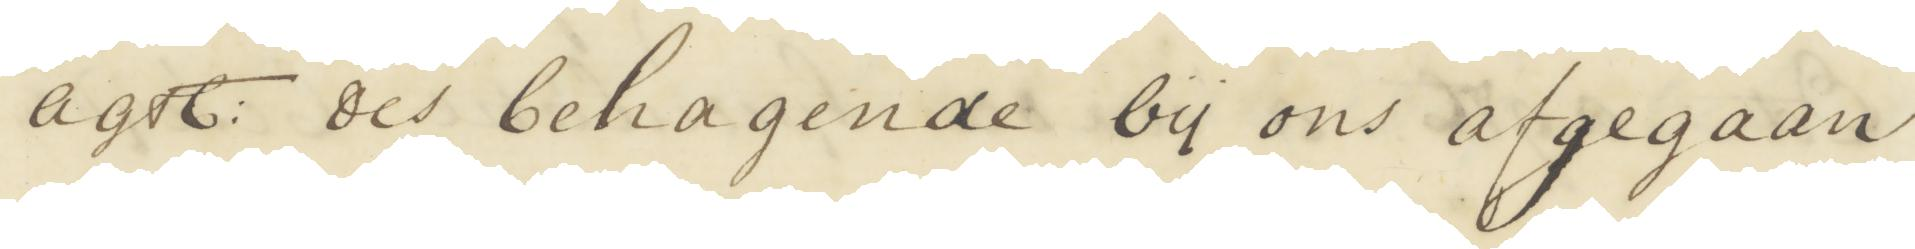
agtb: des behagende bij ons afgegaan
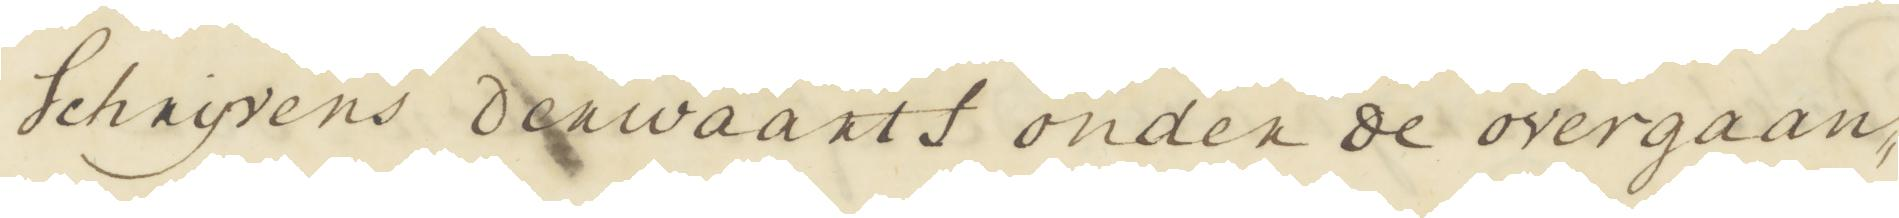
schrijvens derwaarts onder de overgaan„
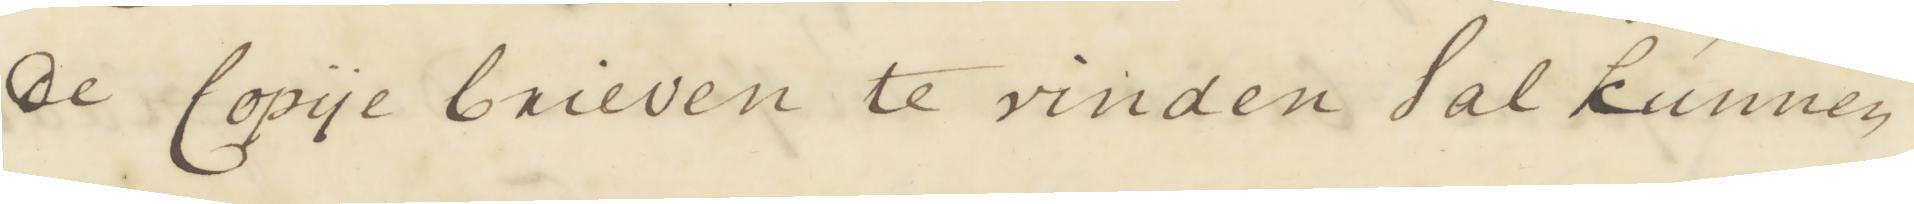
de Copije brieven te vinden sal kunnen
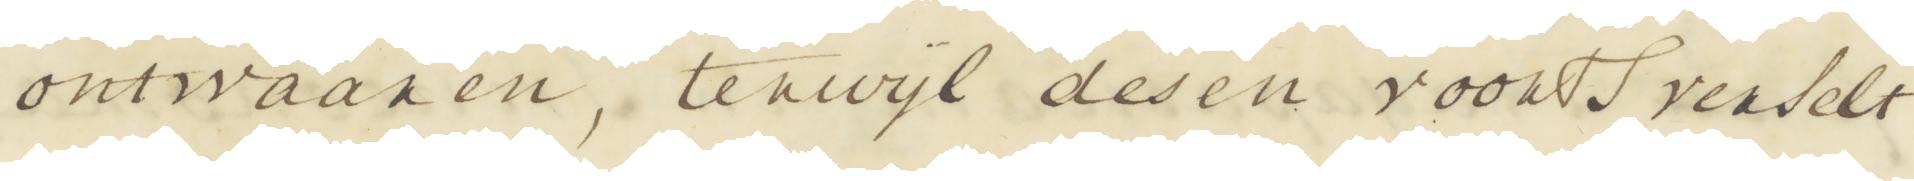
ontwaaren, terwijl desen voorts verselt
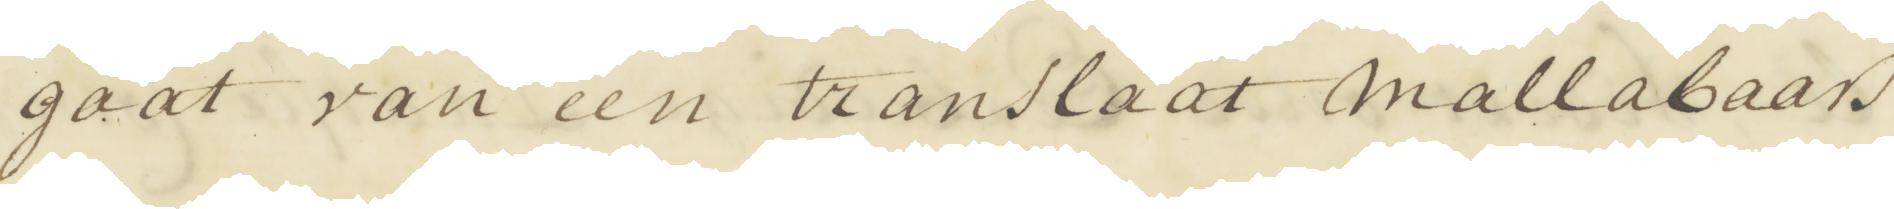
gaat van een translaat mallabaars
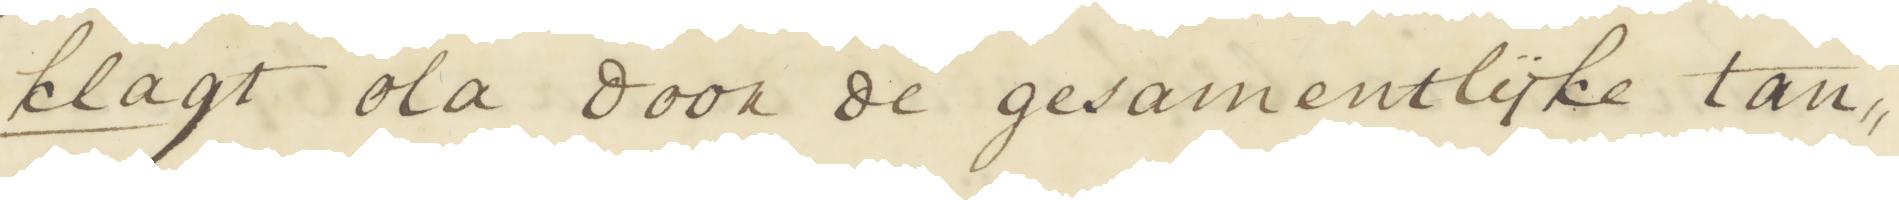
klagt ola door de gesamentlijke tan„
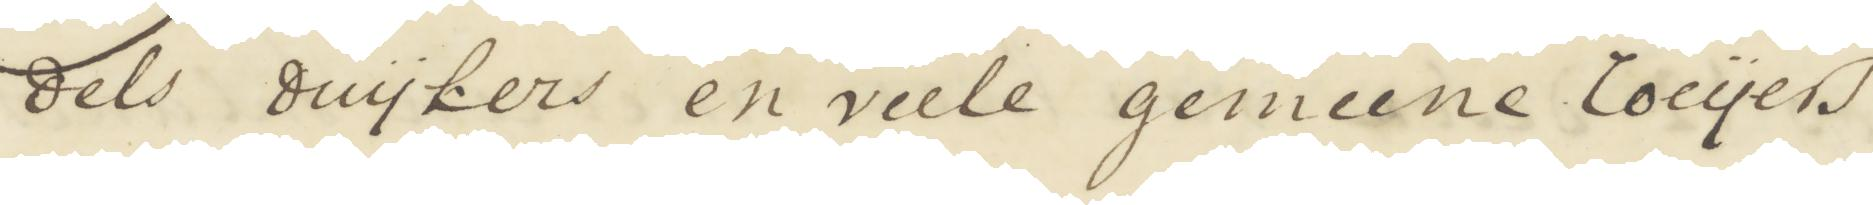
dels duijkers en veele gemeene Roeijers
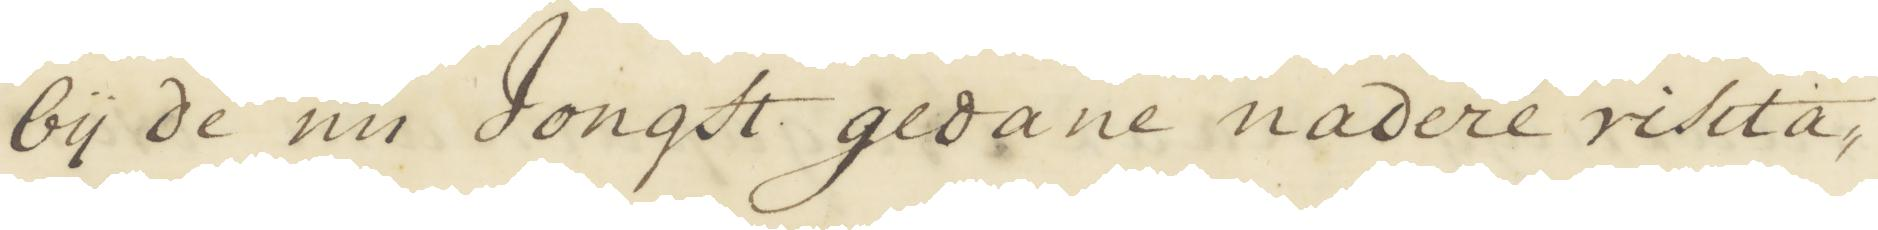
bij de nu Iongst gedane nadere visita„
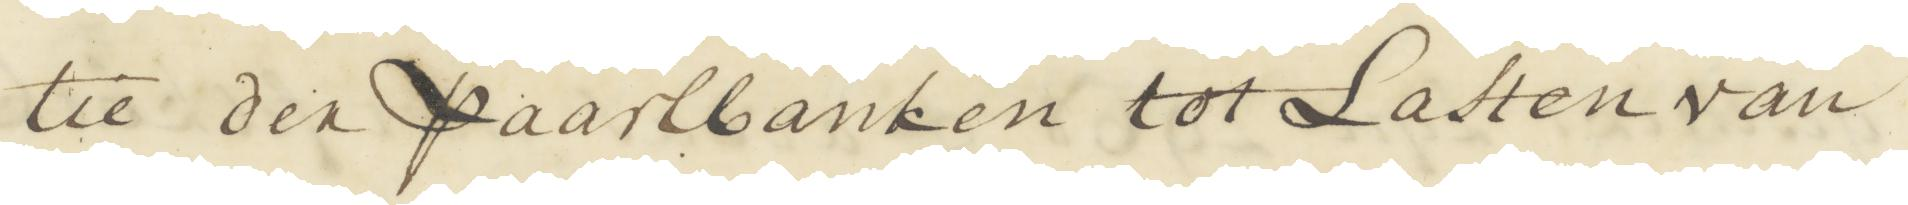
tie der Paarlbanken tot Lasten van
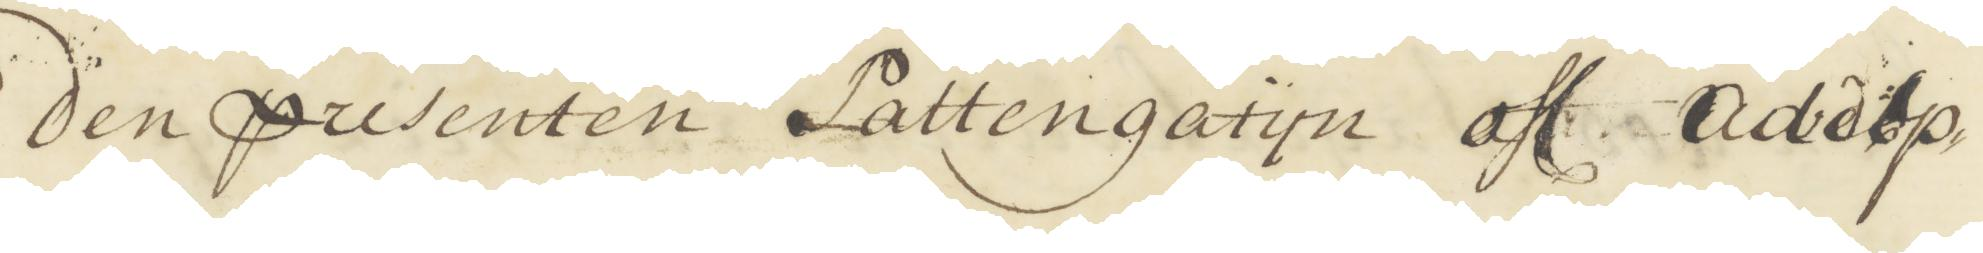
den presenten Pattengatijn off Adolp„
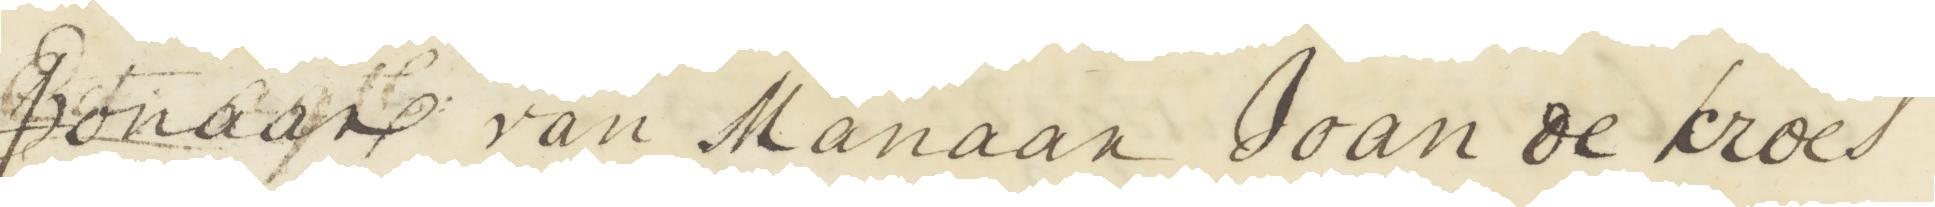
Ponaar van Manaar Ioan de kroes
